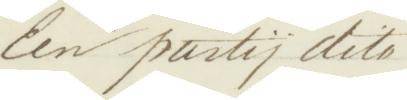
Een partij dito
